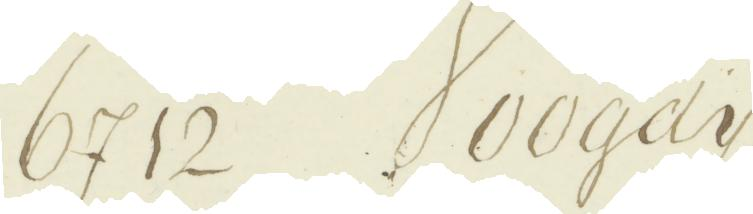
No 6712 Voogdij
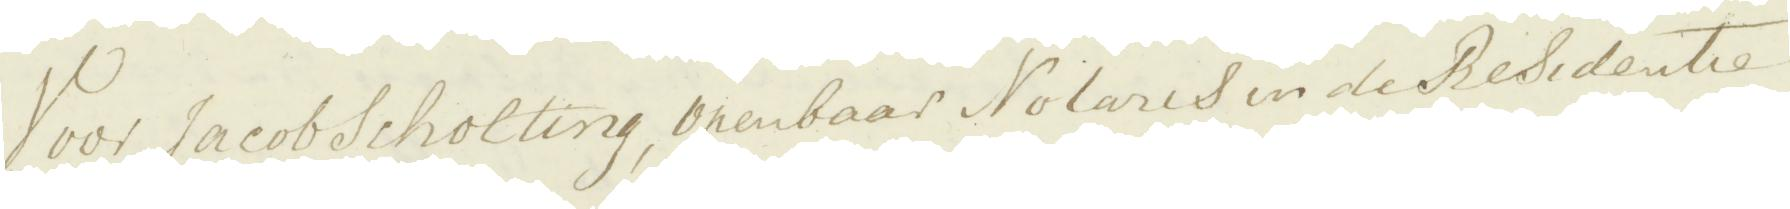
Voor Jacob Scholting, openbaar Notaris in de Residentie
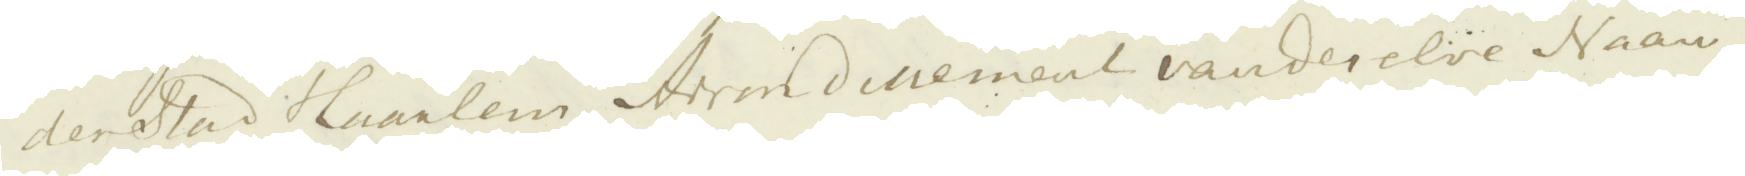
der Stad Haarlem, Arrondisement van deselve Naam,
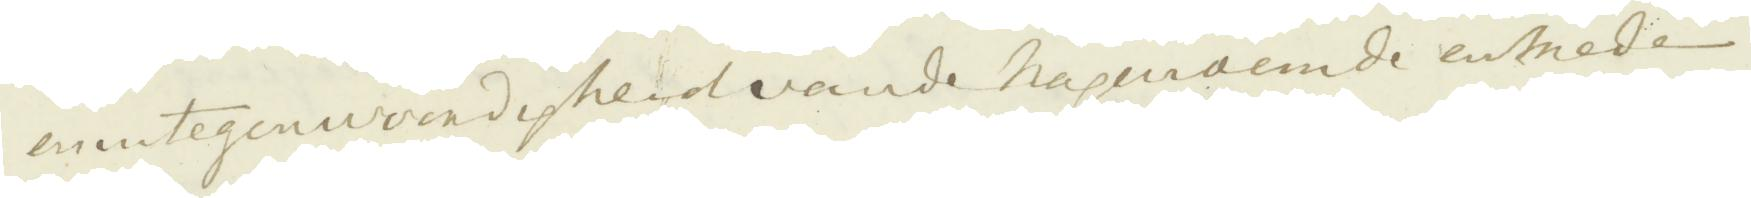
en integenwoordigheijd vande nagenoemde en mede
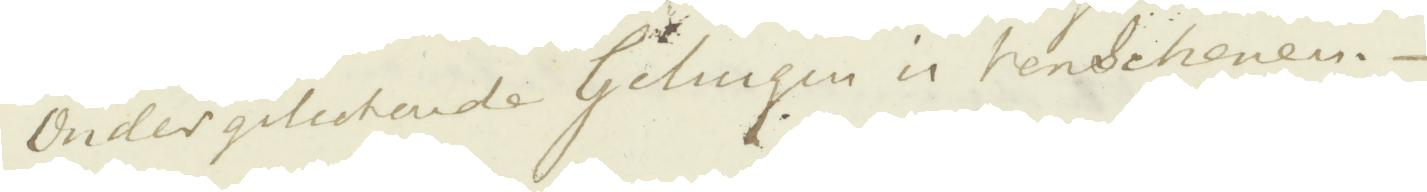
onder geteekende Getuigen is verschenen.
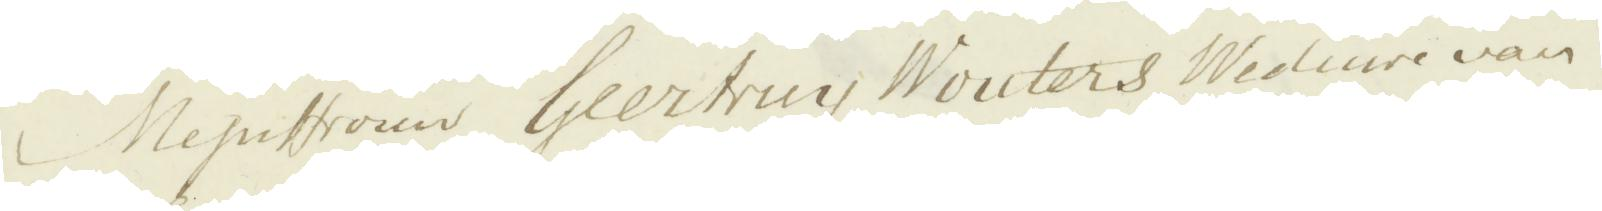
Mejuffrouw Geertruij Wouters, Weduuwe van
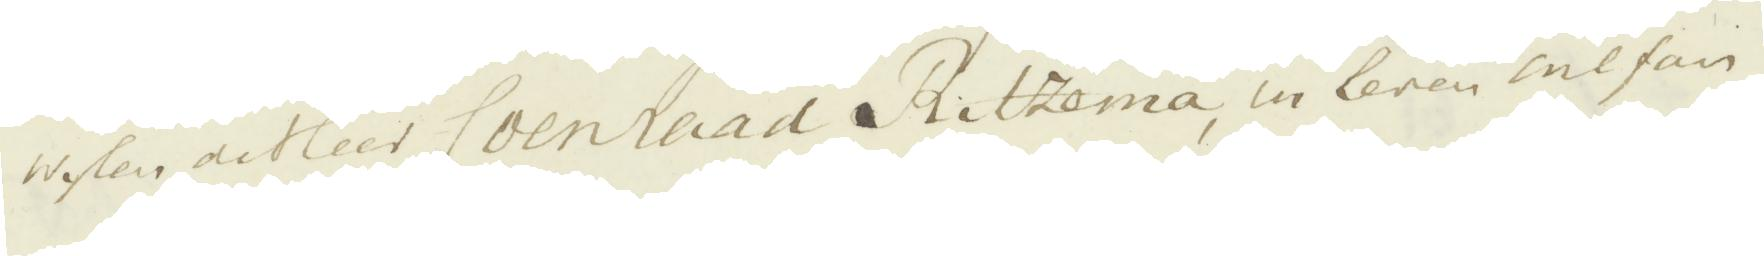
wylen de Heer Coenraad Ritzama, in leven ontfan
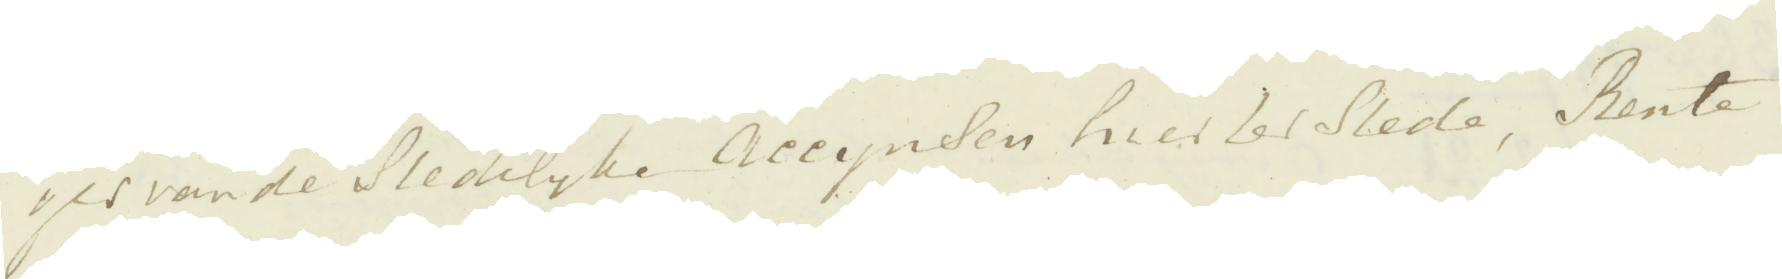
ger van de stedelyke accynsen hier ter Stede, Rente
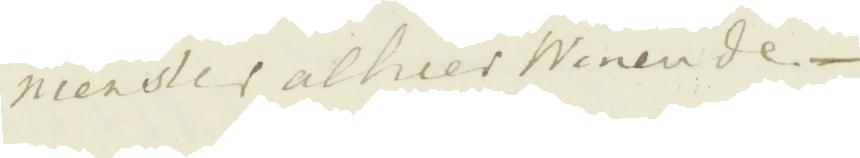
nierster alhier wonende.
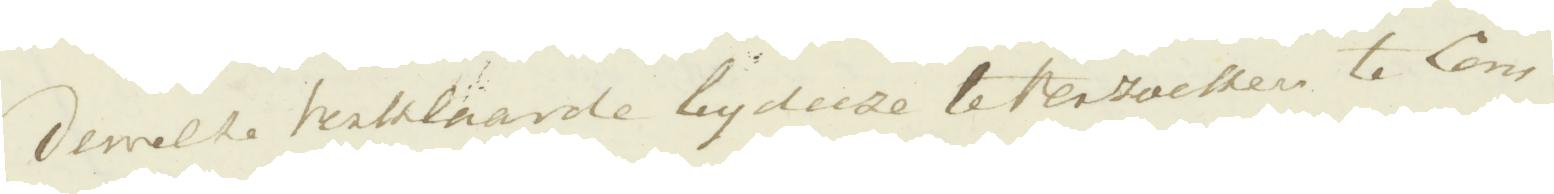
dewelke verklaarde by deeze te verzoeken te com
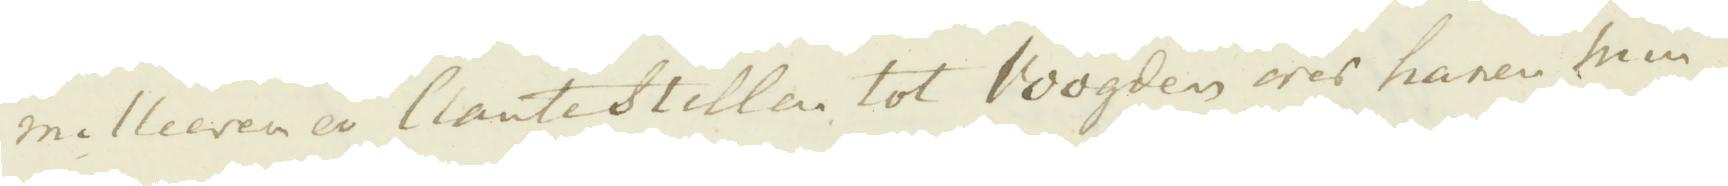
mitteeren en Aantestellen, tot Voogden over haren min
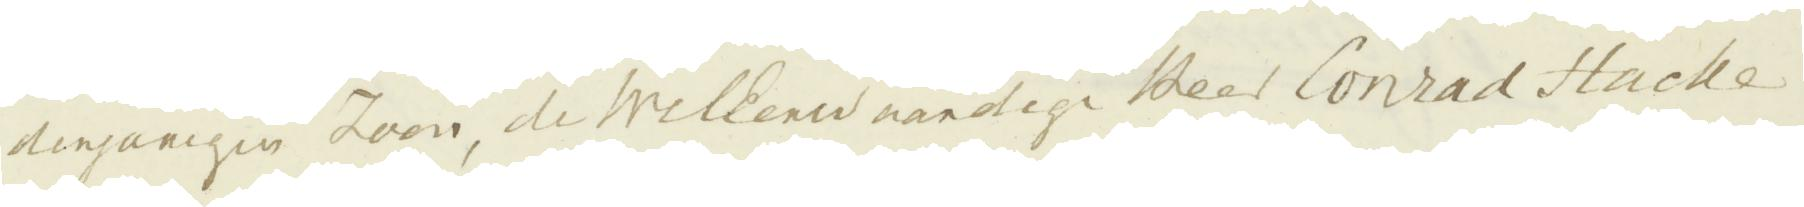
derjarigen zoon, de WelEerwaardige Heer Conrad Hacke
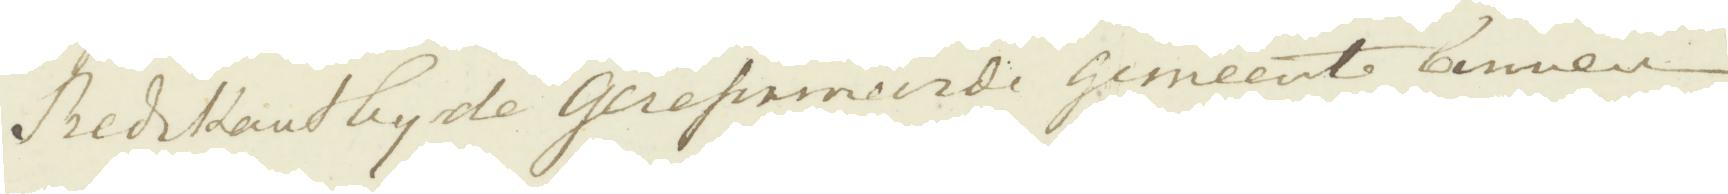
Predicant by de Gereformeerde Gemeente binnen
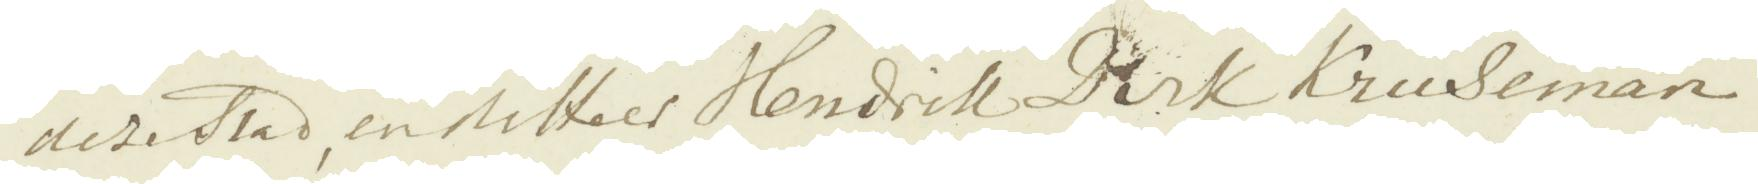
deze stad, en de Heer Hendrik Dirk Kruseman
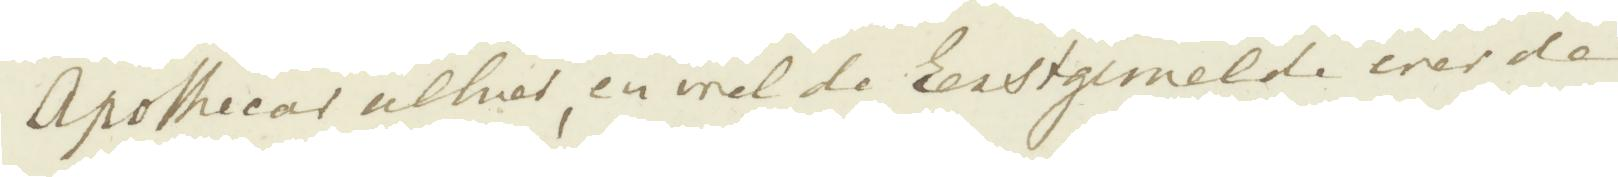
Apothecar alhier, en wel de Eerstgemelde over de
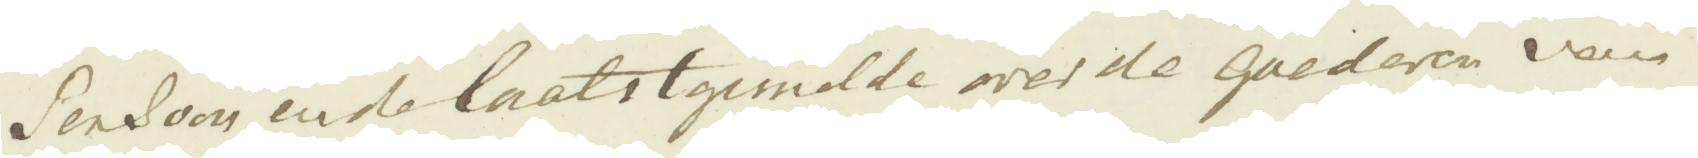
Persoon en de laatstgemelde over de goederen van
